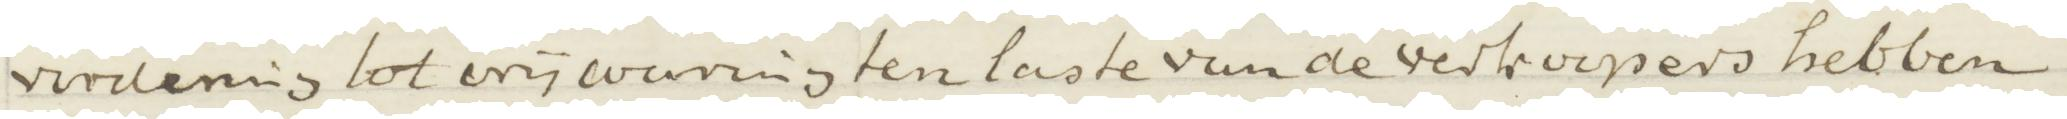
vordering tot vrijwaring ten laste van de verkoopers hebben
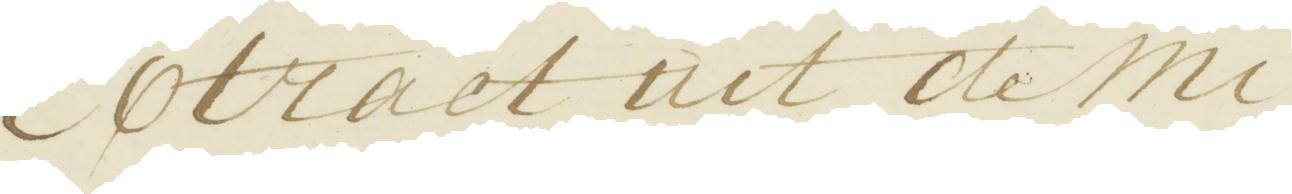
Extract uit de mi
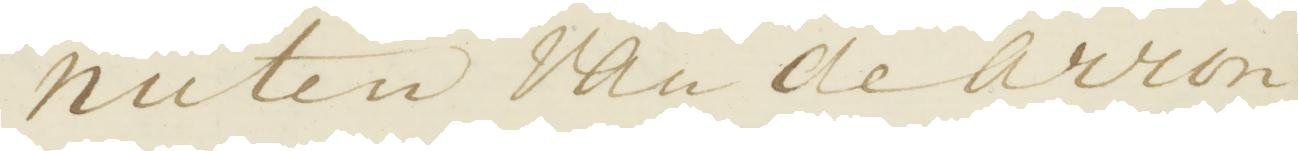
nuten van de arron
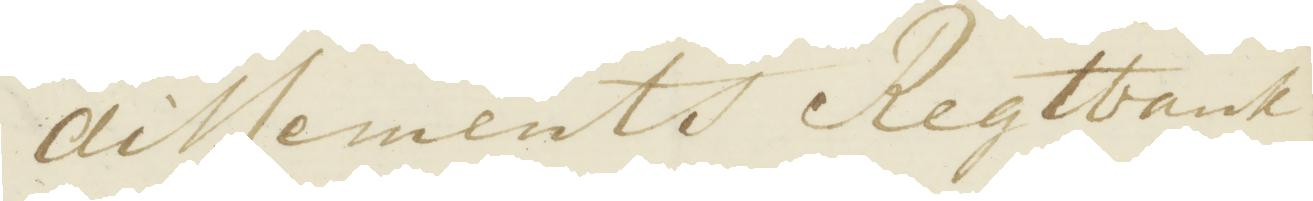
dissements Regtbank
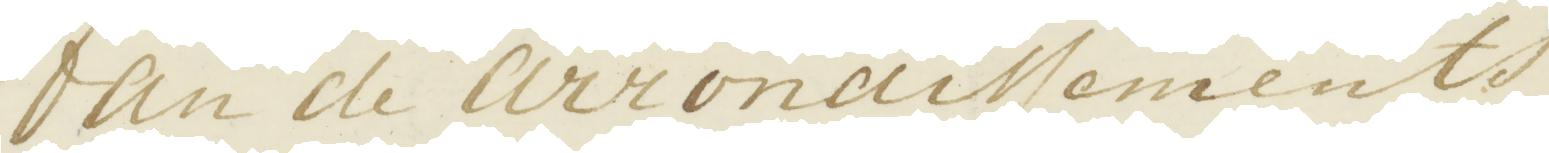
Aan de Arrondissements
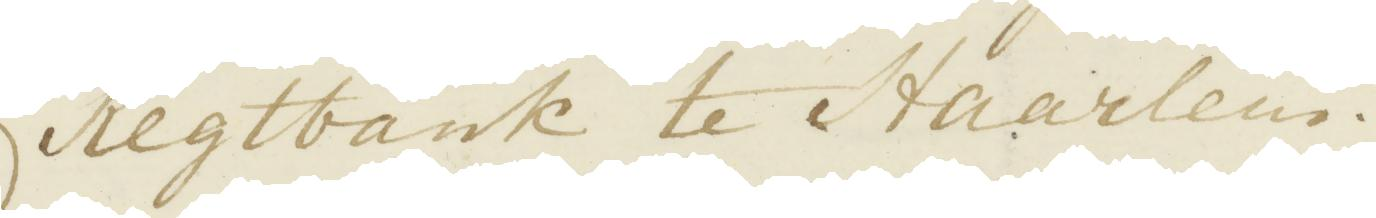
Regtbank te Haarlem.
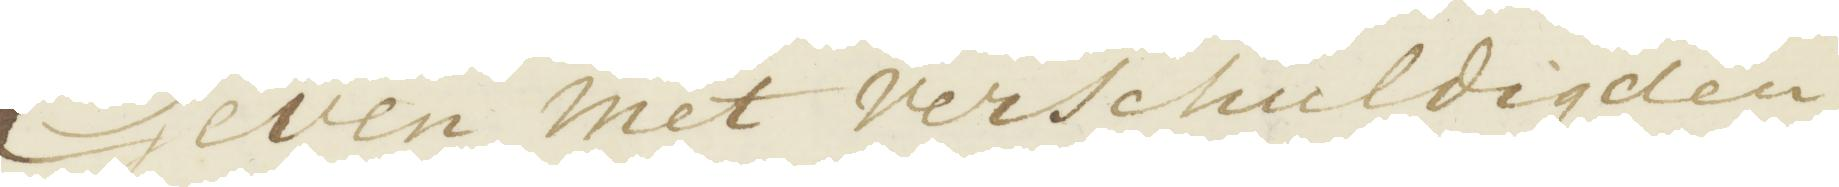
Geven met verschuldigden
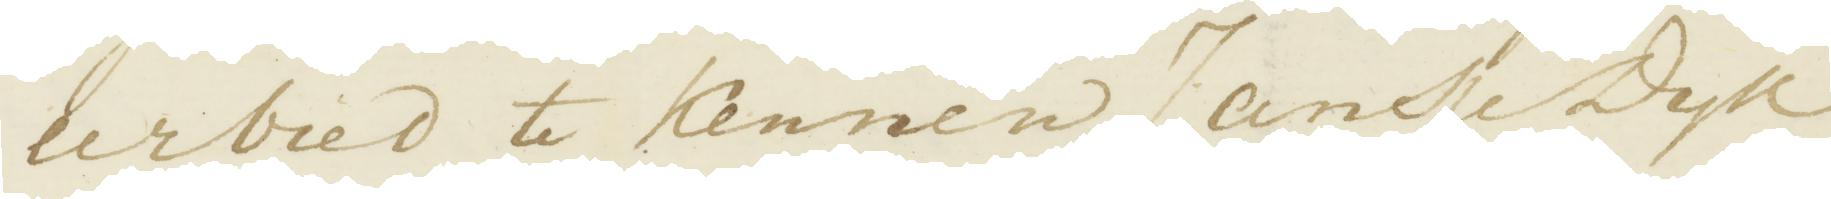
eerbied te kennen Jansje Dyk
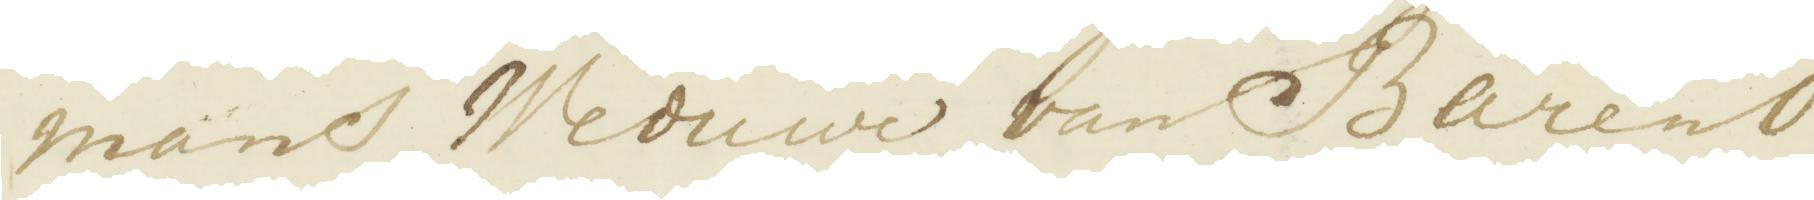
mans Weduwe van Barend
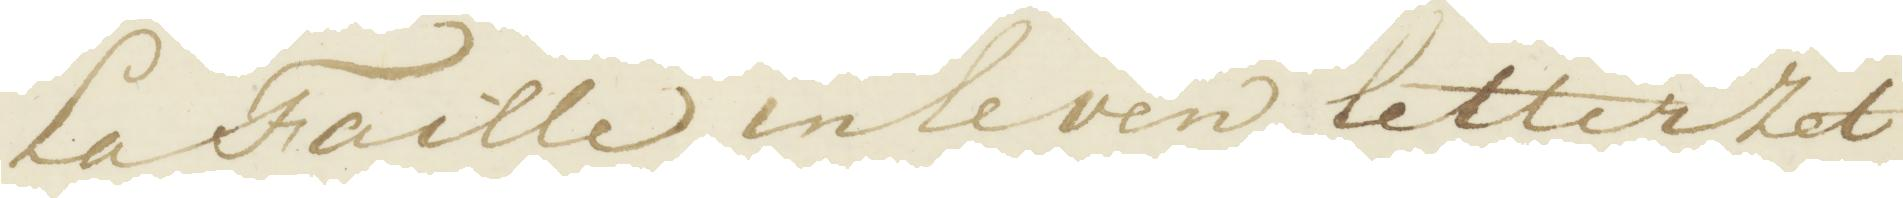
la Faille in leven letterzet
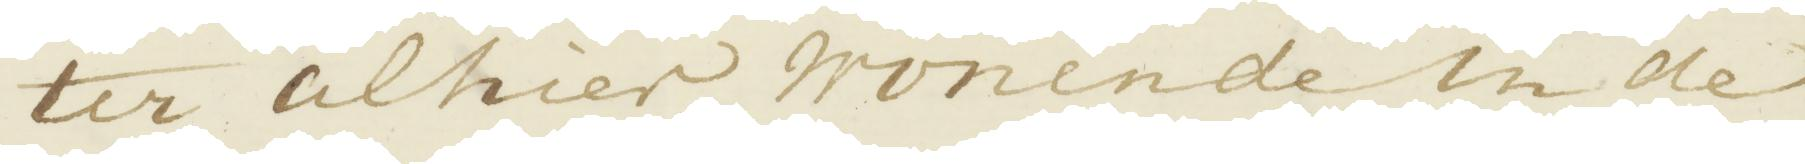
ter alhier wonende in de
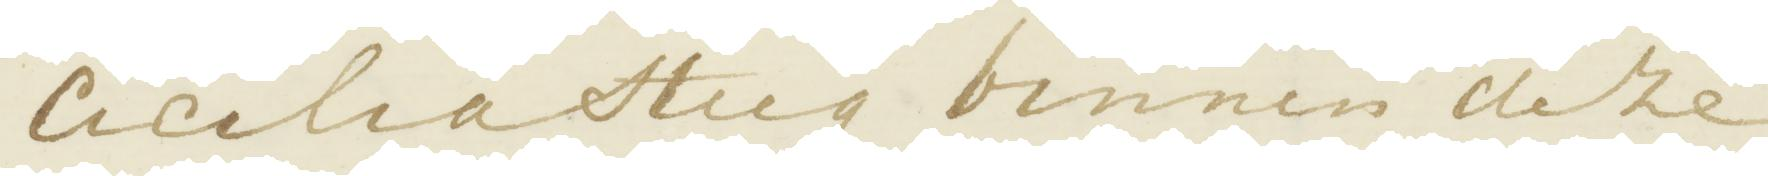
Ciciliasteeg binnen deze
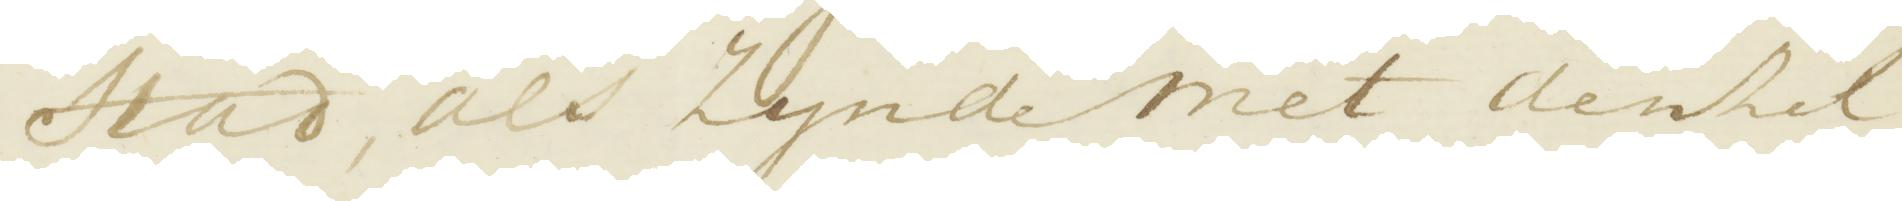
stad, als Zynde met denzel
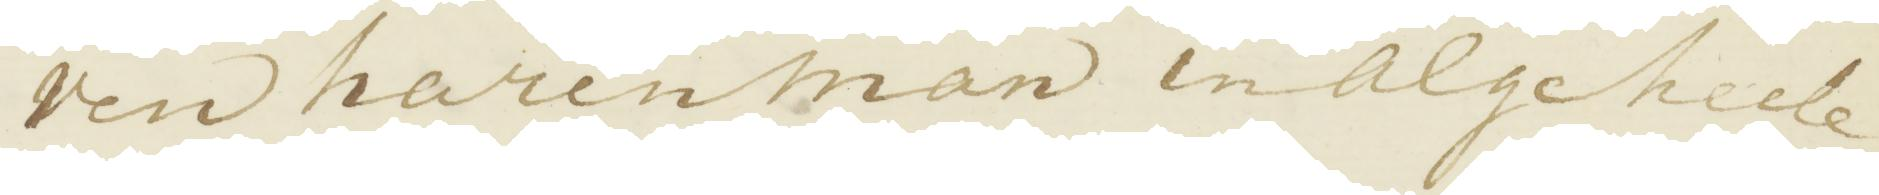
ven haren man in algeheele
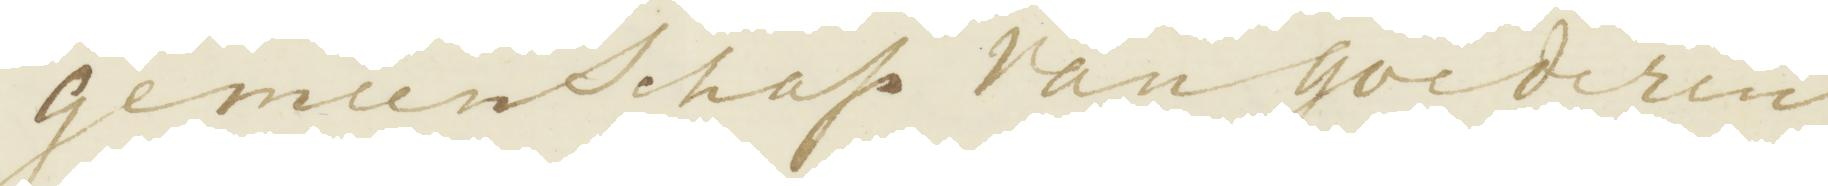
gemeenschap van goederen
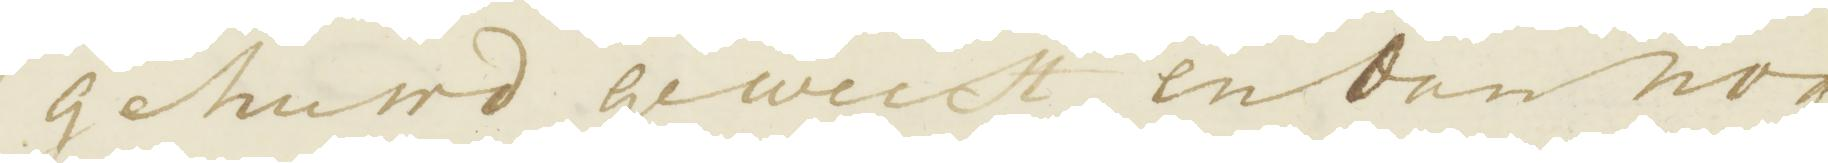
gehuwd geweest en dan nog
